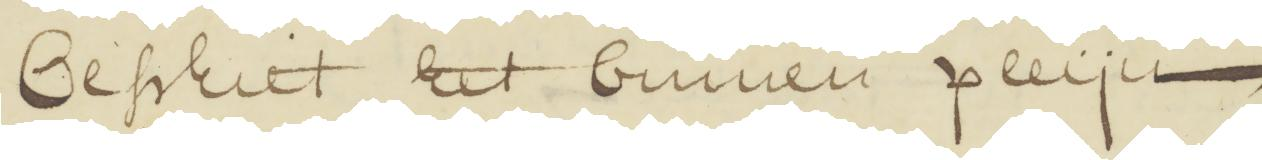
beschiet het binnen pleijn
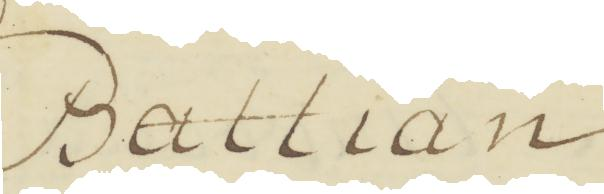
Battian
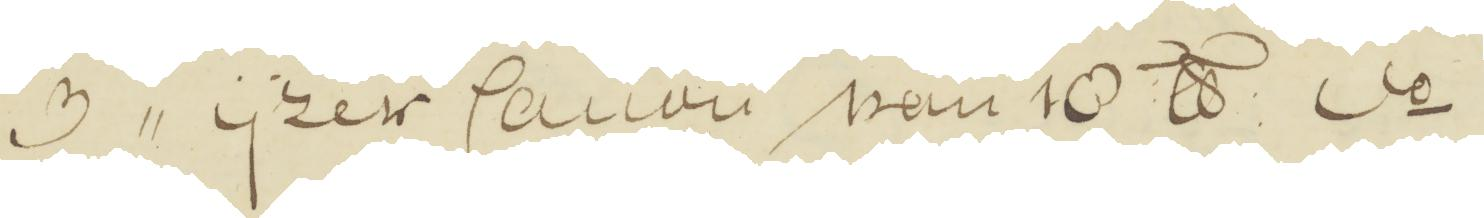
3 „ ijzer Canon van 18:' lb: _=o
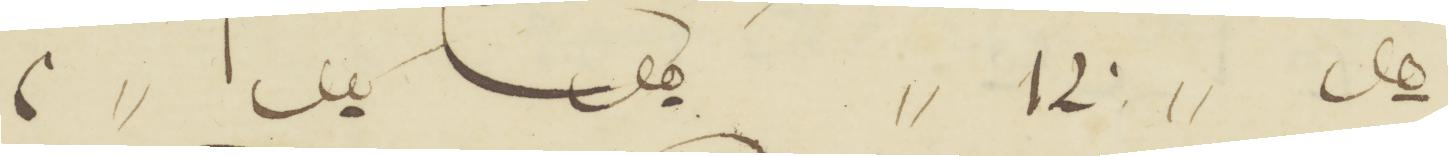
5 „ _-o _-o „ 12: „ _-o
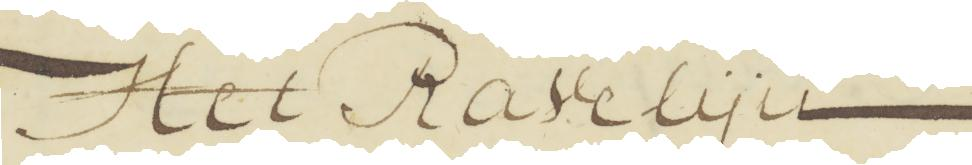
Het Ravelijn
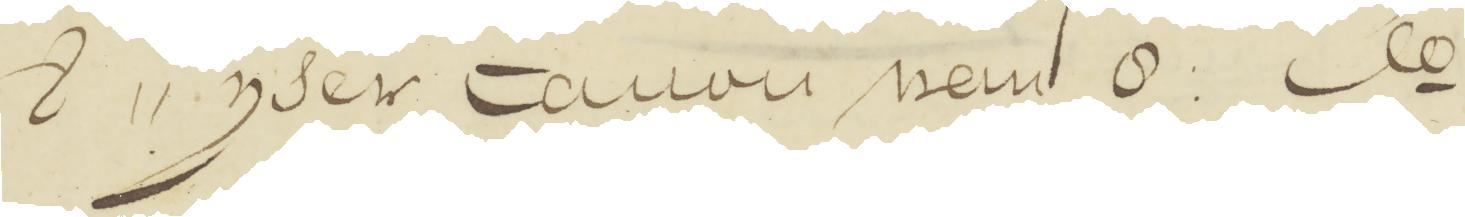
8 „ ijser canon van 8: _-o
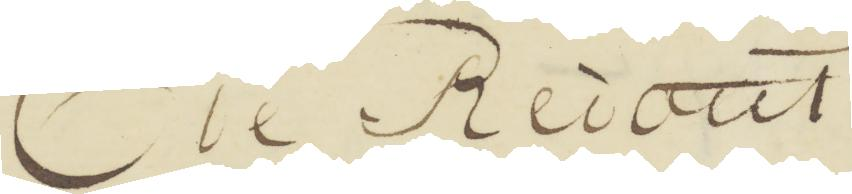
De Redout
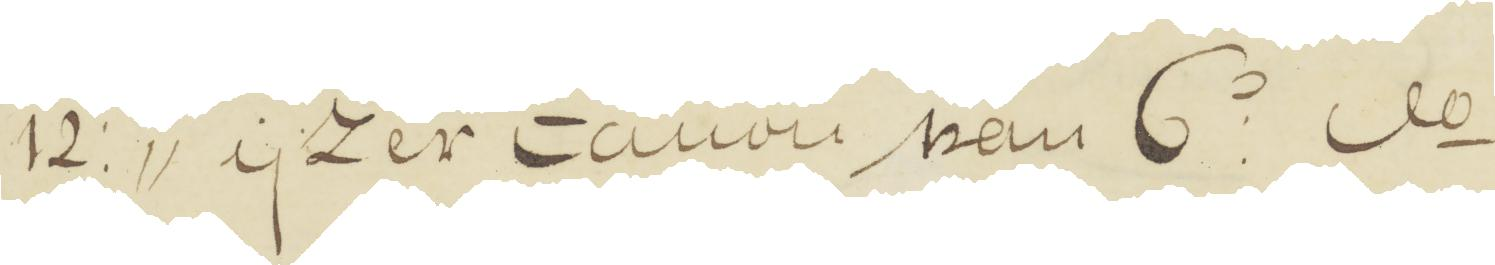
12: „ ijzer canon van 6:' _-o
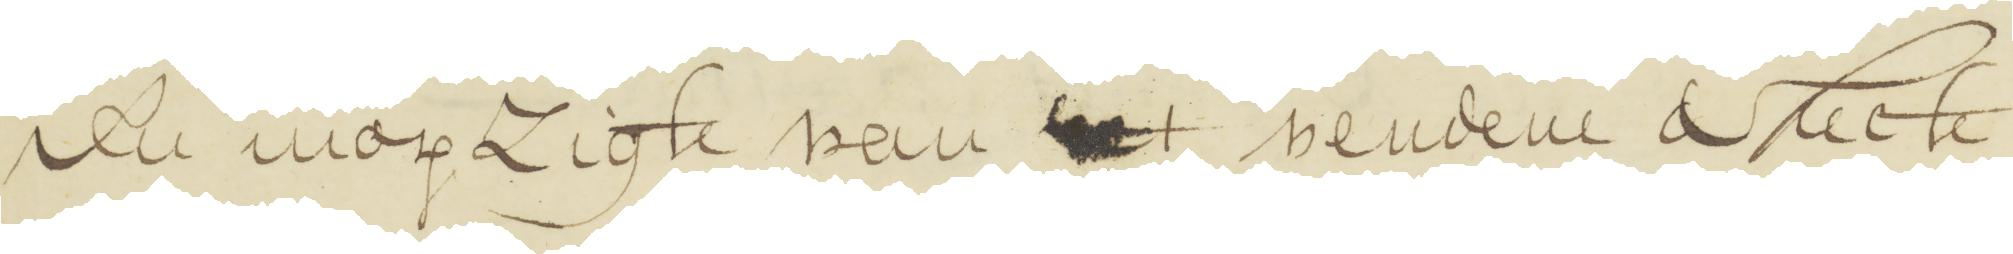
En in opzigte van het verdere defecte
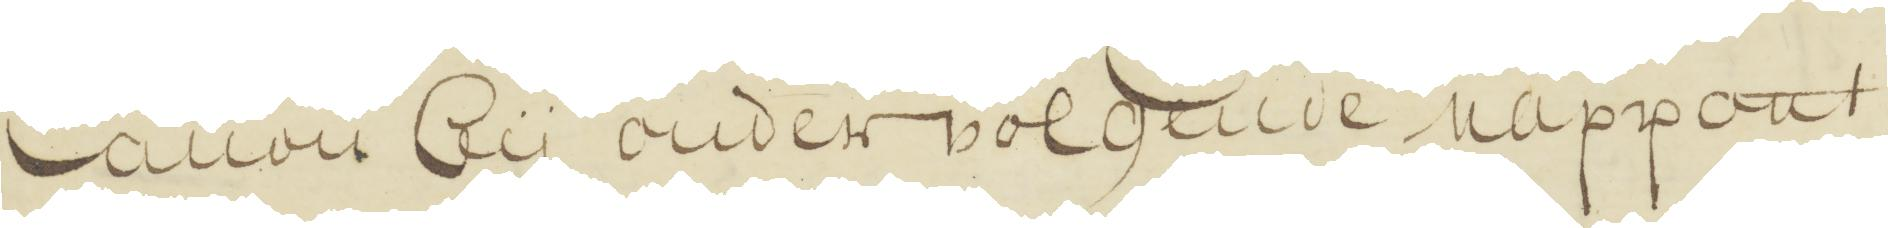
canon bij ondervolgende rapport
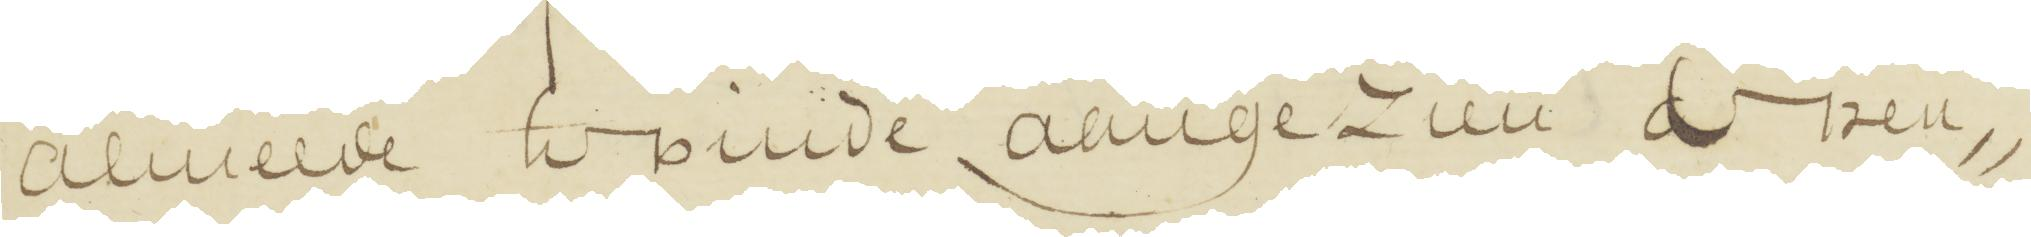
almeede te vinde aangezien de ver„
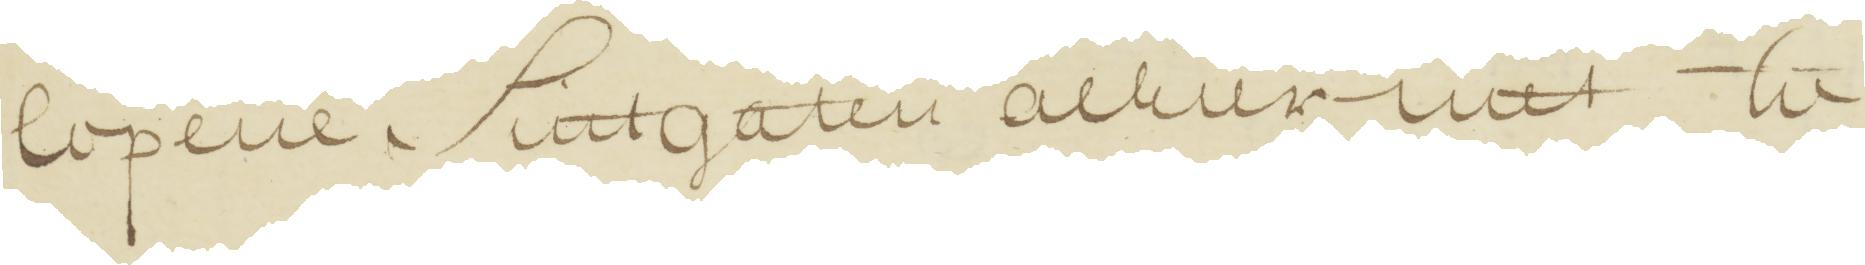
lopene sintgaten alhier niet te
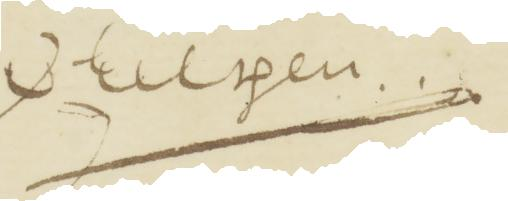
verhelpen. .
